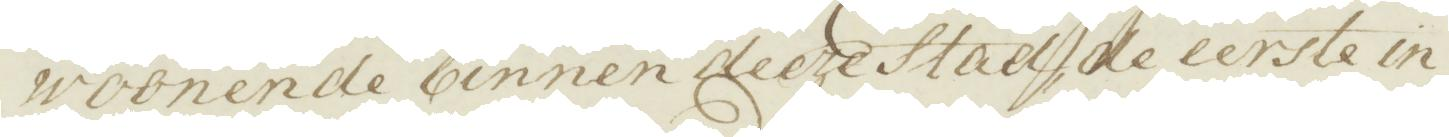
woonende binnen deeze stad, de eerste in
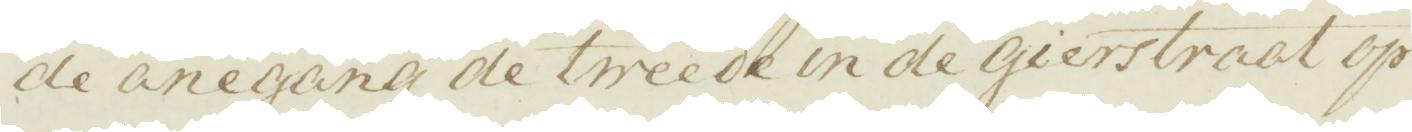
de anegang de tweede in de gierstraat op
